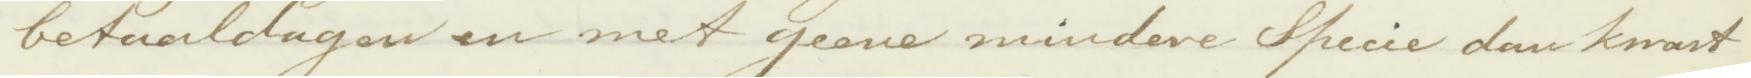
betaaldagen en met geene mindere specie dan kwart
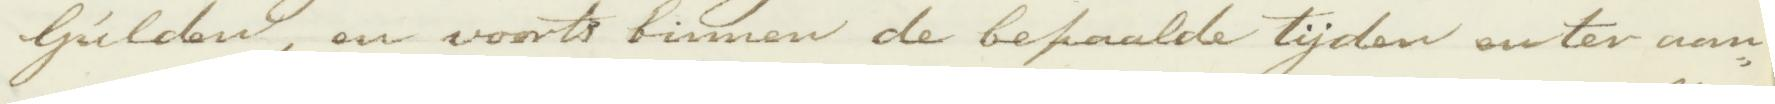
Gulden, en voorts binnen de behaalde tijden en ter aan=
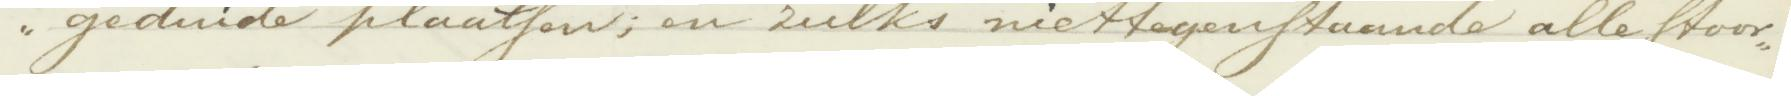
„geduide plaatsen; en zulks niet tegenstaande alle stoor=
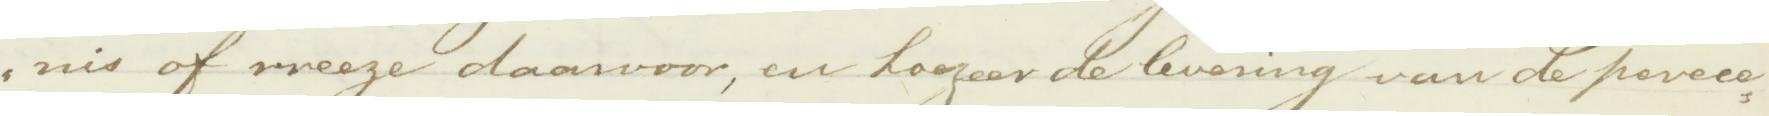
nis of vreeze daarvoor, en hoezeer de levering van de percee=
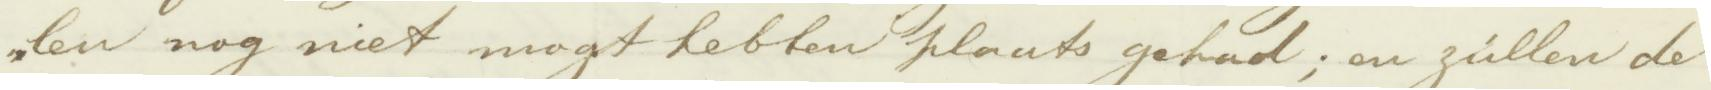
„len nog niet mogt hebben plaats gehad; en zullen de
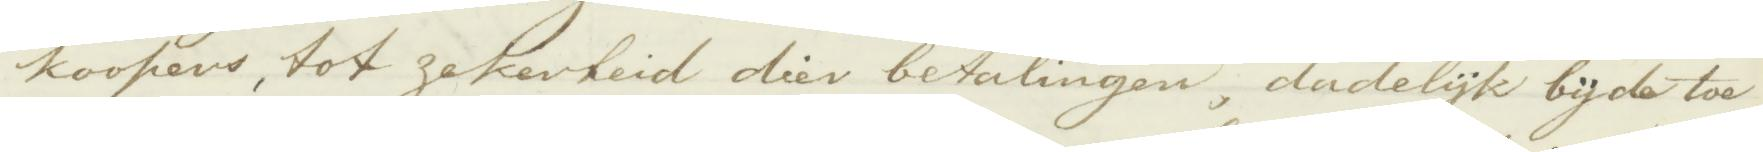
koopers, tot zekerheid dier betalingen, dadelijk bij de toe=
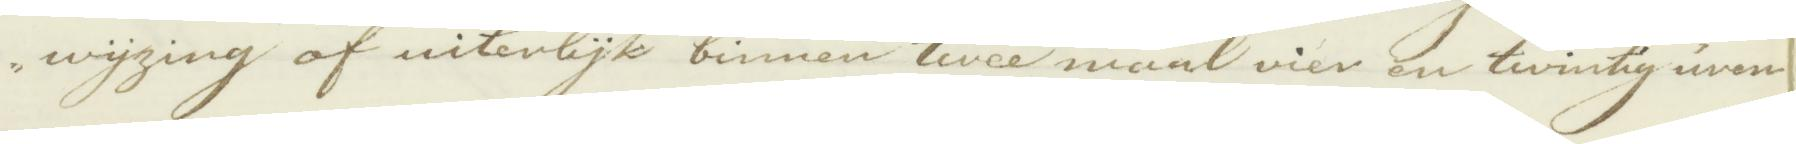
„wijzing of uiterlijk binnen twee maal vier en twintig uren
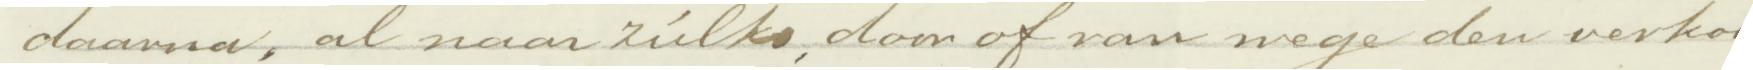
daarna, al naar zulks door of van wege den verkoo=
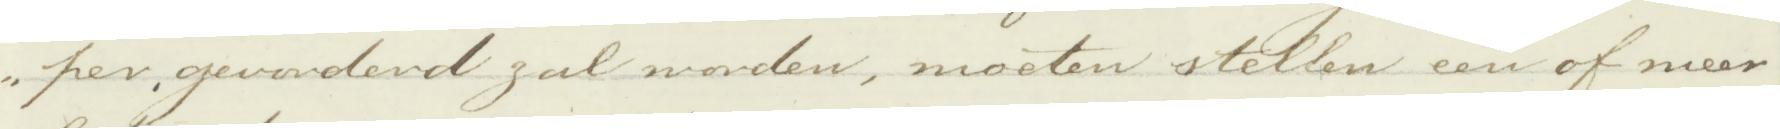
„per, gevorderd zal worden, moeten stellen een of meer
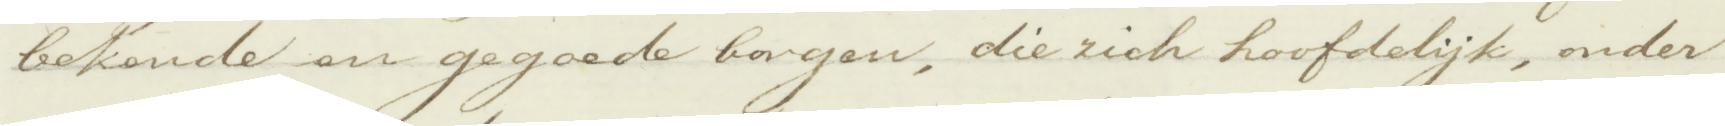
bekende en gegoede borgen, die zich hoofdelijk, onder
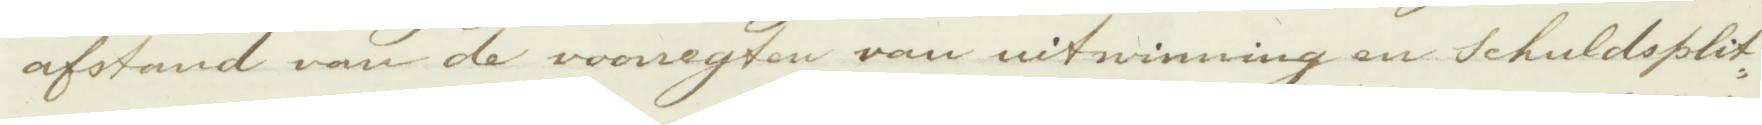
afstand van de voorregten van uitwinning en schuldsplit=
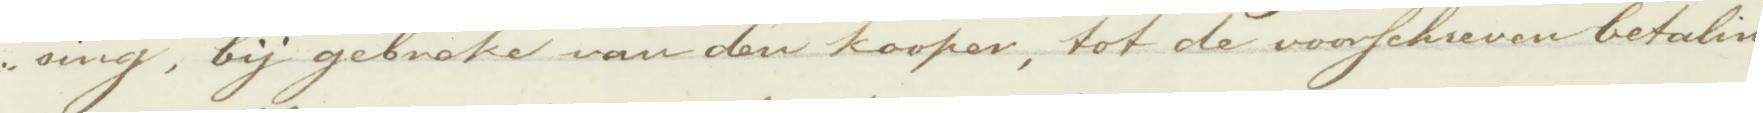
„sing, bij gebreke van den kooper, tot de voorschreven betalin=
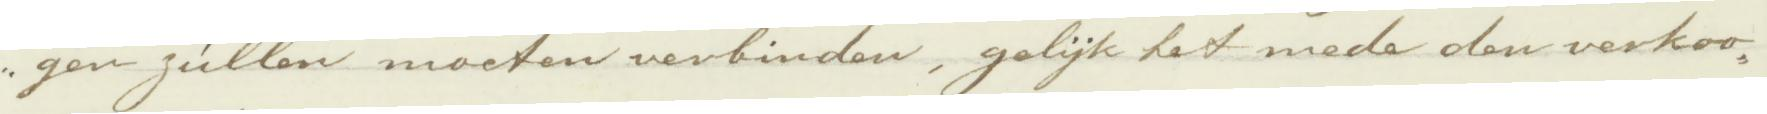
gen zullen moeten verbinden, gelijk het mede den verkoo=
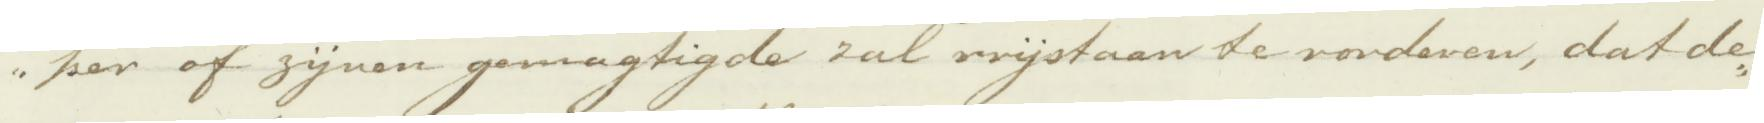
„per of zijnen gemagtigde zal vrijstaan te vorderen, dat de=
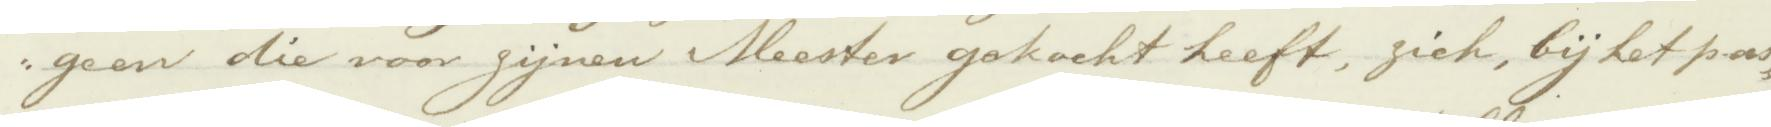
„geen die voor zijnen Meester gekocht heeft, zich, bij het pas
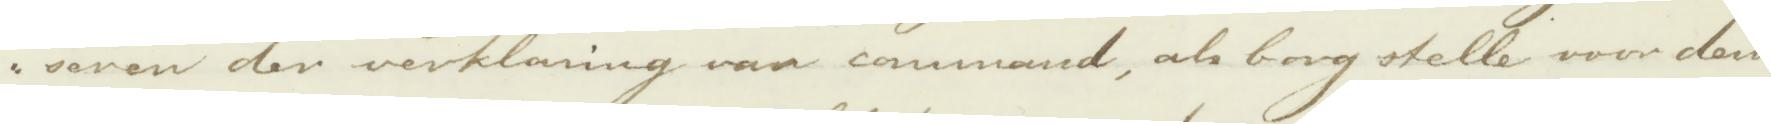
„seren der verklaring van command, als borg stelle voor den
